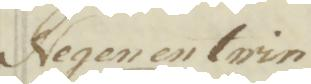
Negen en twin
